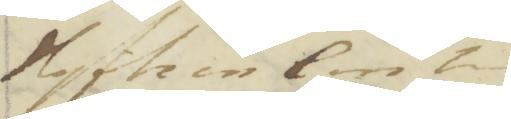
Vyftien Cents
